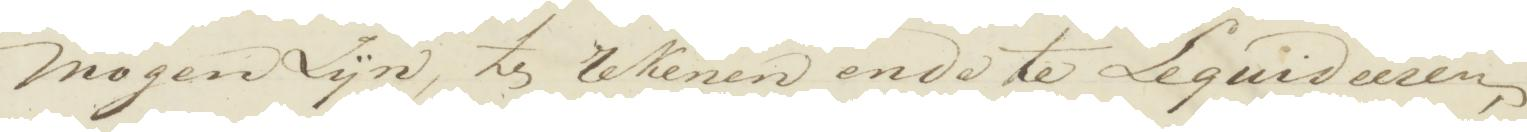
mogen zijn, te rekenen ende te Lequideeren,
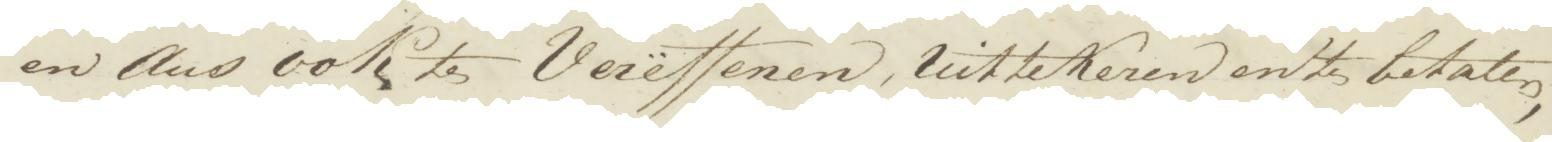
en dus ook te verëffenen, uittekeren en te betalen,
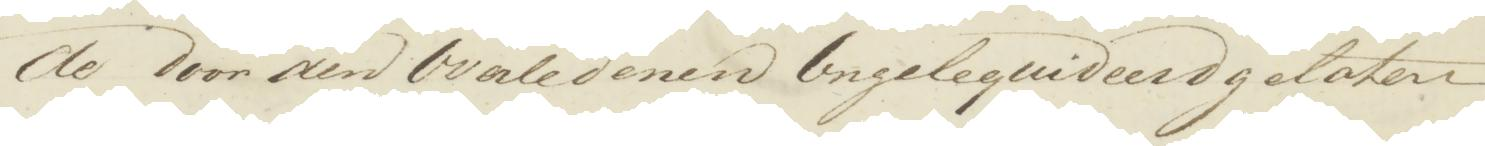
de door den overledenen ongelequideerd gelaten
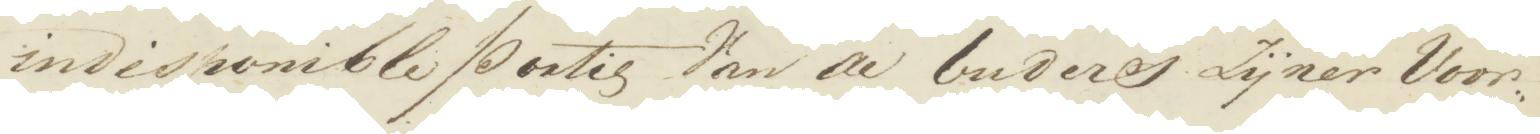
indisponible portie van de ouders zijner voor„
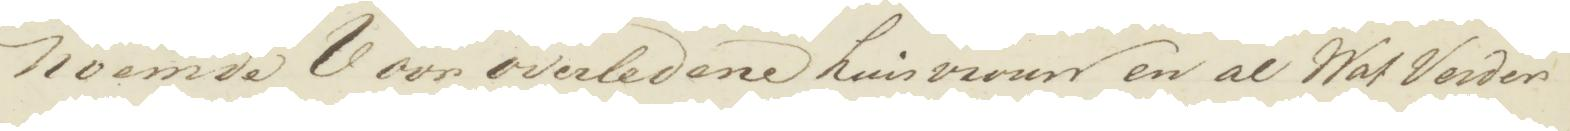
noemde voor overledene huisvrouw en al wat verder
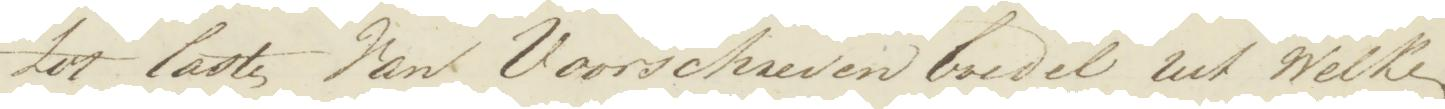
tot lasten van voorschreven boedel uit welke
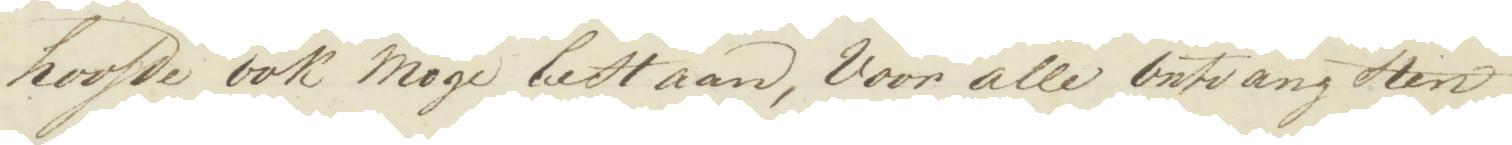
hoofde ook moge bestaan, voor alle ontvangsten
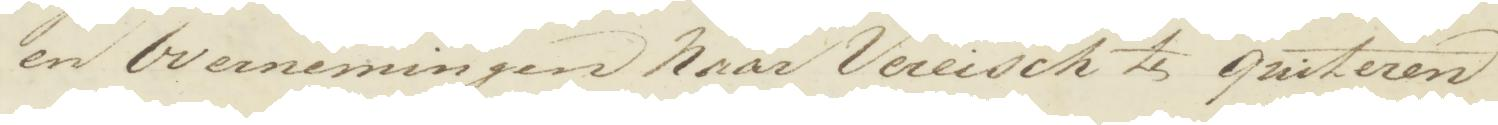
en overnemingen naar vereisch te quiteren
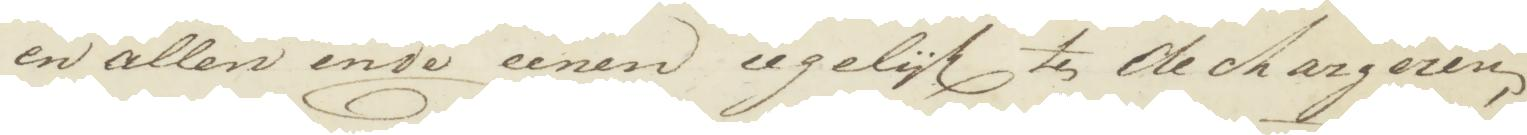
en allen ende eenen iegelijk te dechargeren,
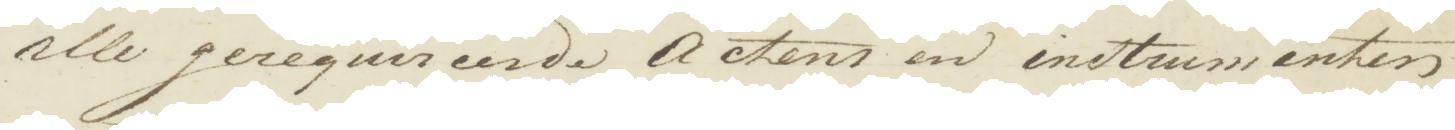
alle gerequireerde Actens en instrumenten
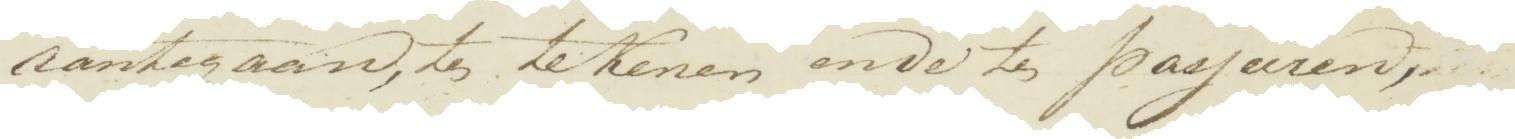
aantegaan, te tekenen ende te passeeren,
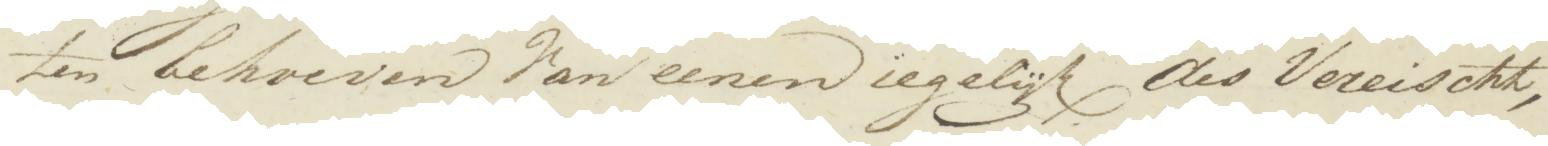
ten behoeven van eenen iegelijk des vereischt,
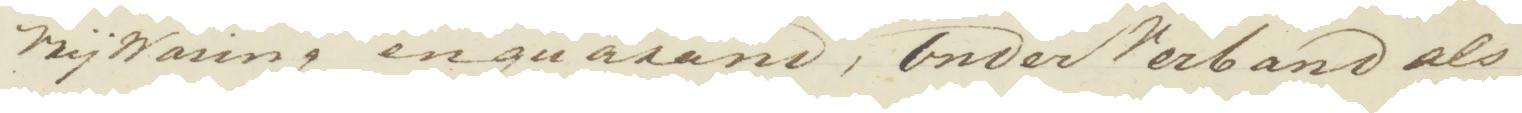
vrij waring en guarand, onder verband als
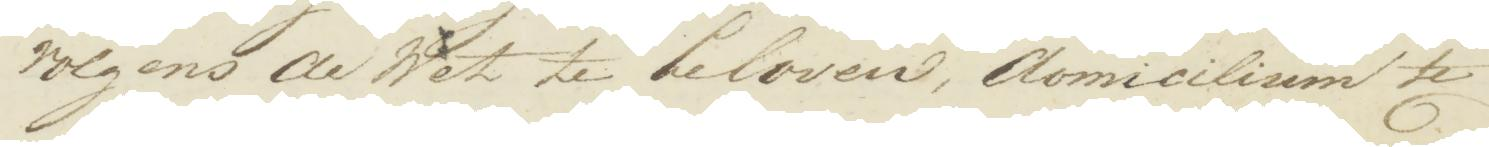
volgens de Wet te beloven, domicilium te
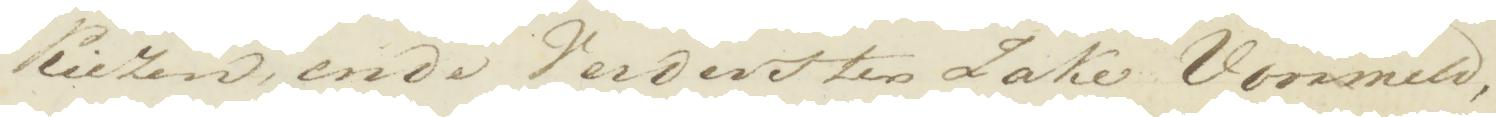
kiezen, ende verders ter zake voormeld,
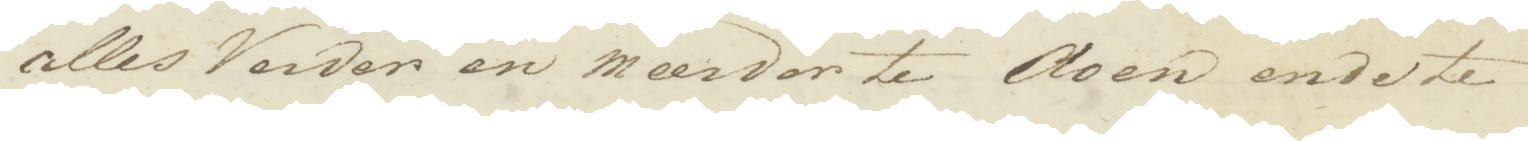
alles verder en meerder te doen ende te
